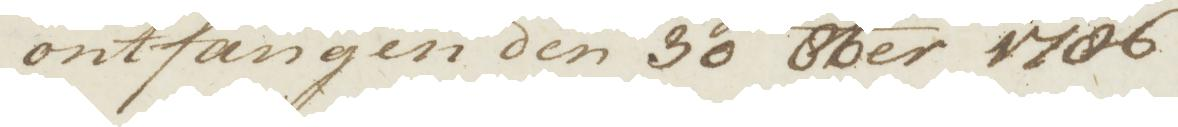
ontfangen den 30 8ber 1786
